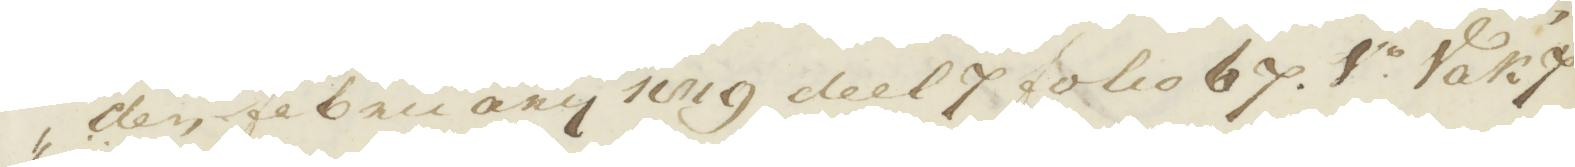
„den februarij 1819 deel 7 folio 67. V:o Vak 7
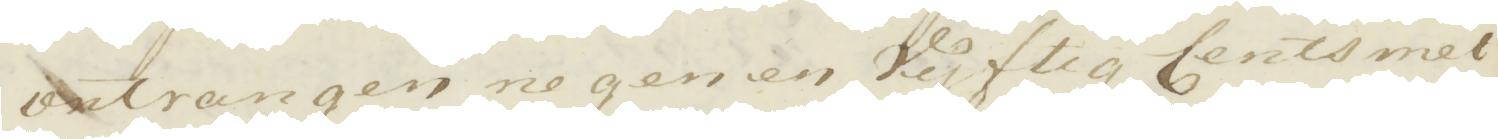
ontvangen negen en Vijftig Cents met
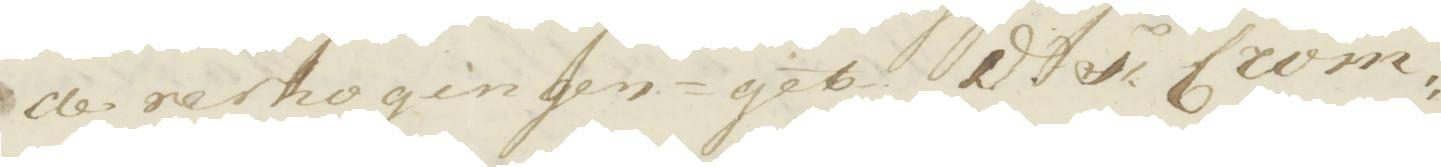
de verhogingen=get: D. F. Crom„
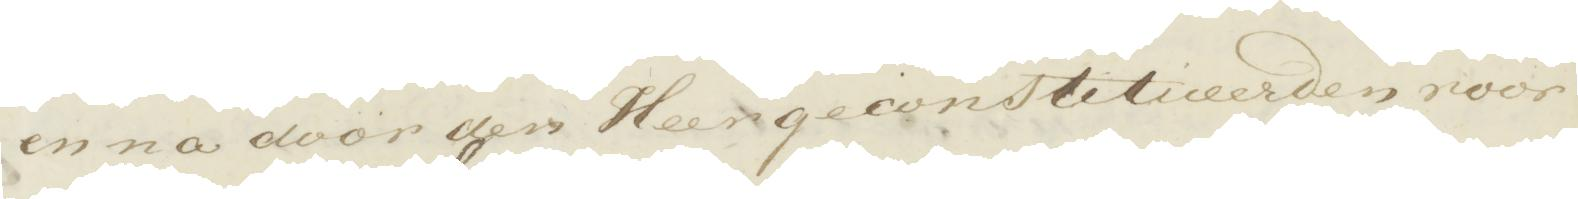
en na door den Heer geconstitueerden voor
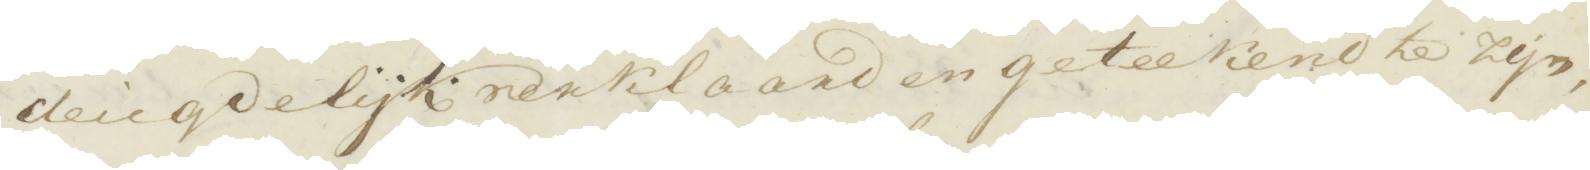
deugdelijk verklaard en geteekend te zijn,
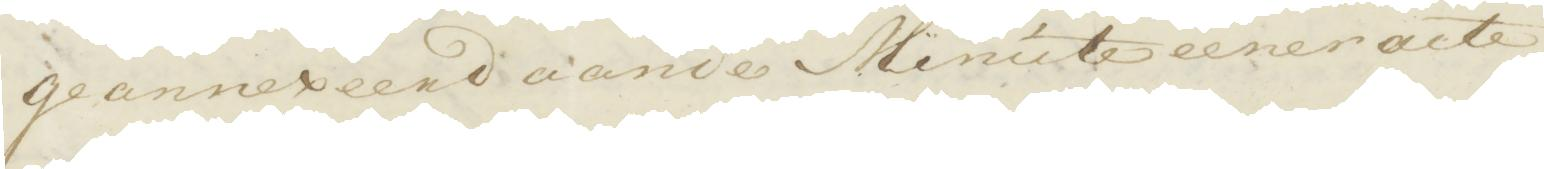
geannexeerd aande Minute eener acte
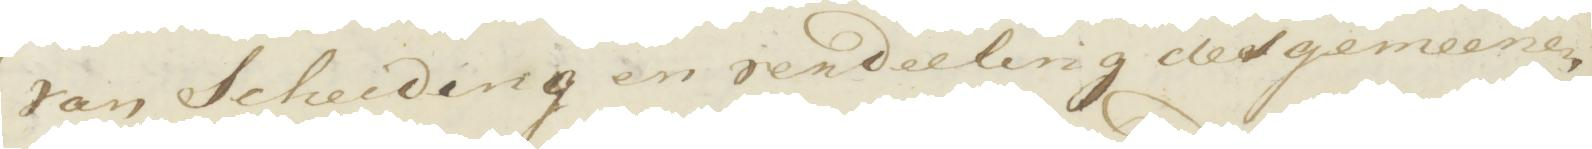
van Scheiding en verdeeling des gemeenen
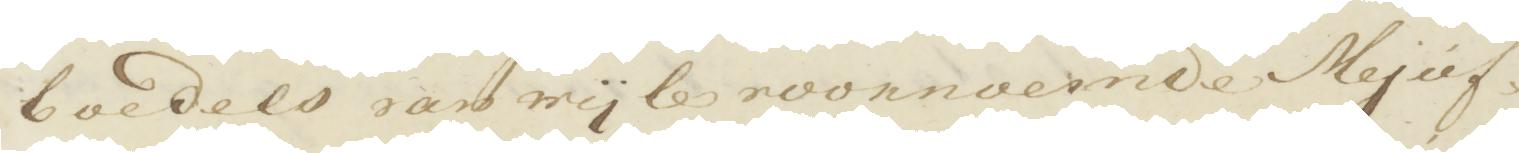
boedels van wijle voornoemde Mejuf„
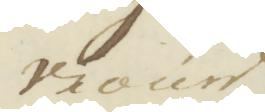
vrouw
